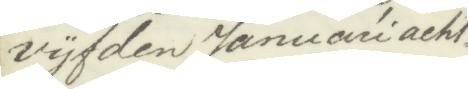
vijfden Januari acht
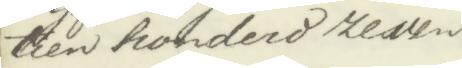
tien honderd zeven
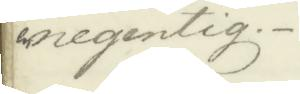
ennegentig. –
